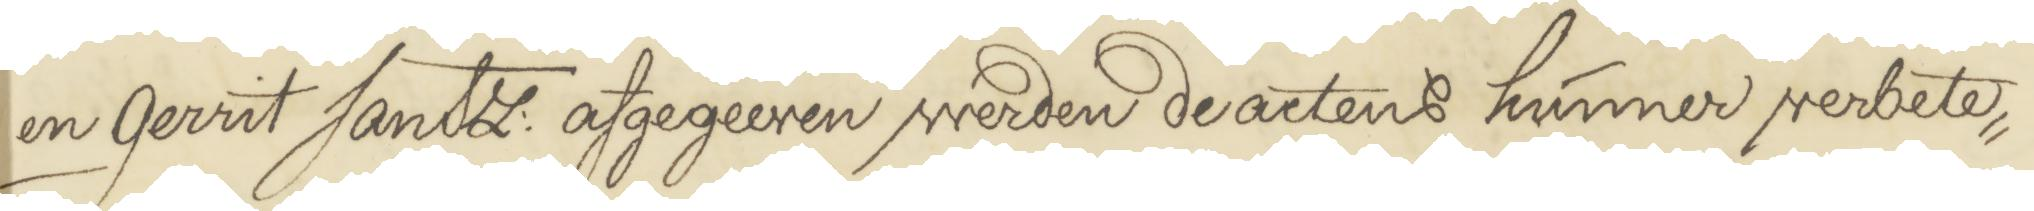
en Gerrit Jansz: afgegeeven werden de actens hunner verbete„
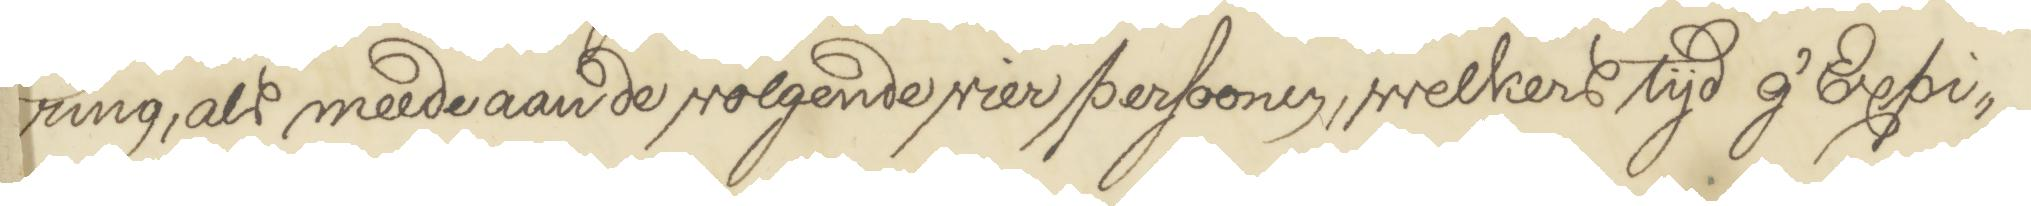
ring, als meede aan de volgende vier persoonen, welkers tijd g’Expi„
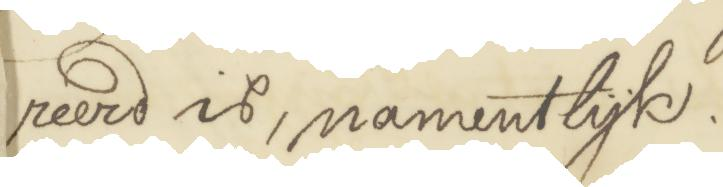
reerd is, namentlijk.
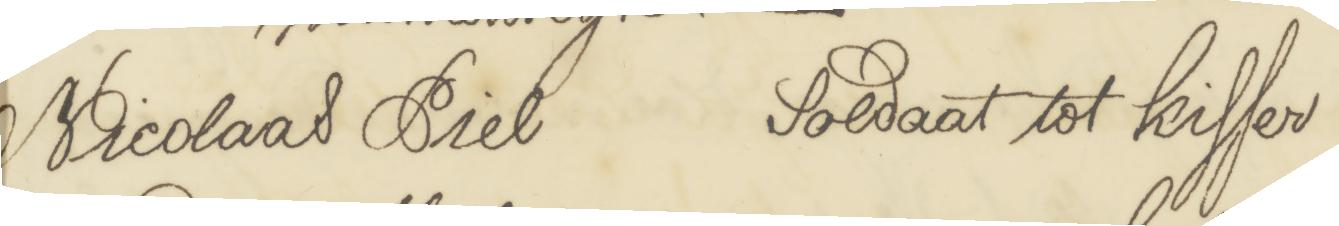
Nicolaas Piel Soldaat tot kisser
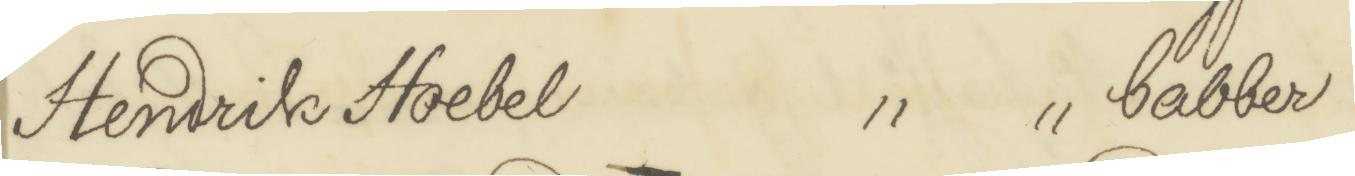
Hendrik Hoebel „ „ babber
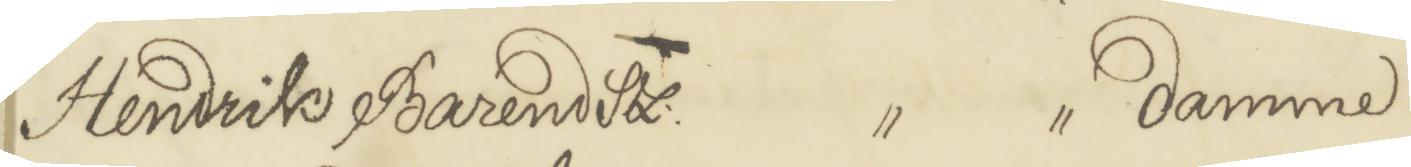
Hendrik Barendsz: „ „ damme
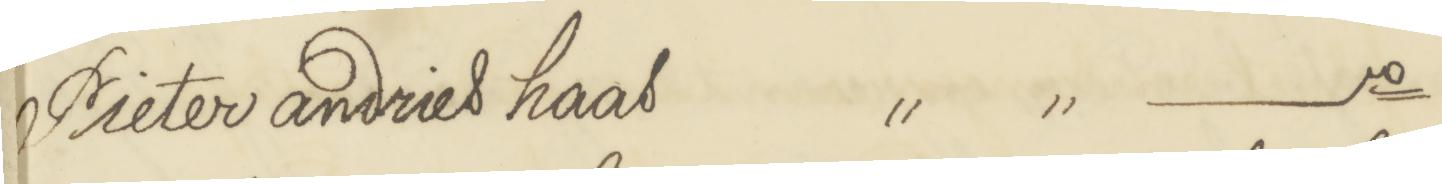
Pieter andries haas „ „ _„o
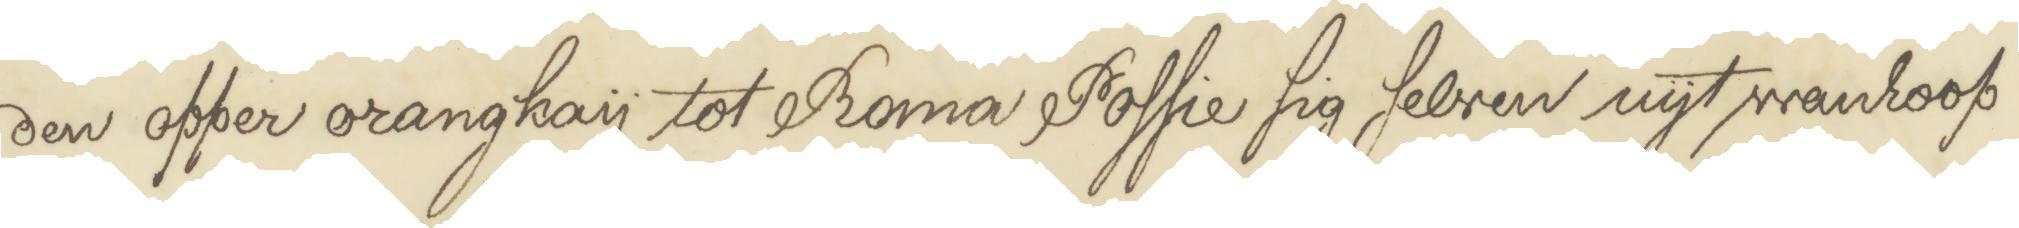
den opper orangkaij tot Roma Possie Sig Selven uijt wanhoop
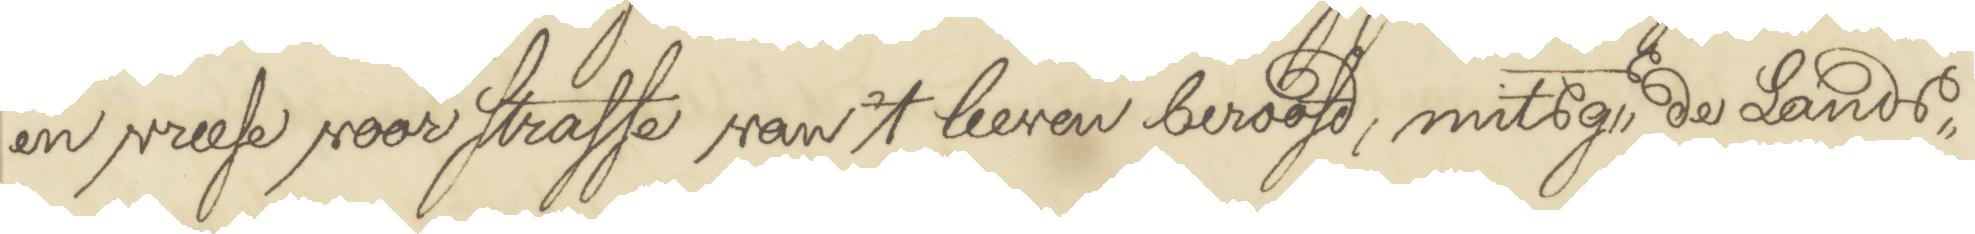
en vreese voor Straffe van ’t leeven beroofd, mitsg„s de Lands„
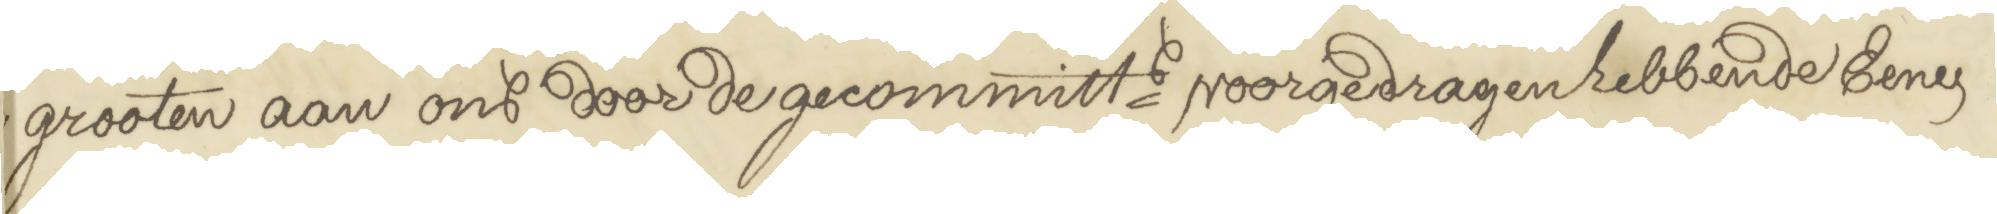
grooten aan ons door de gecommitt=s voorgedragen hebbende Eenen
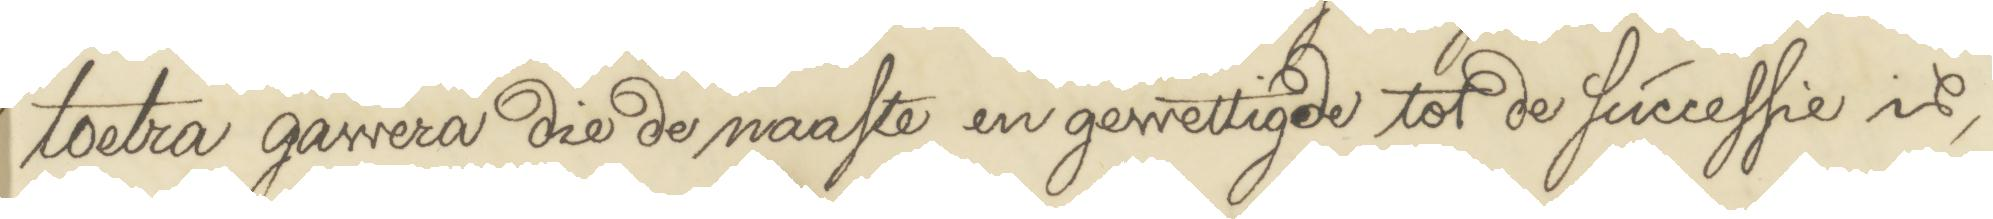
toetra gawera die de naaste en gewettigde tot de successie is,
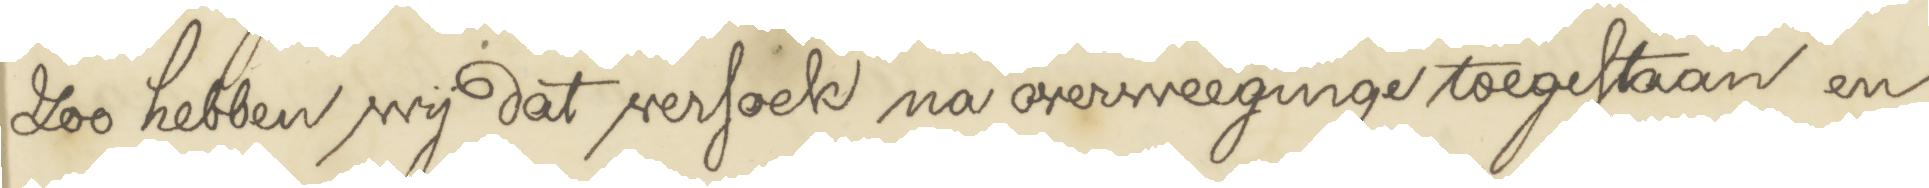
Zoo hebben wij dat versoek na overweeginge toegestaan en
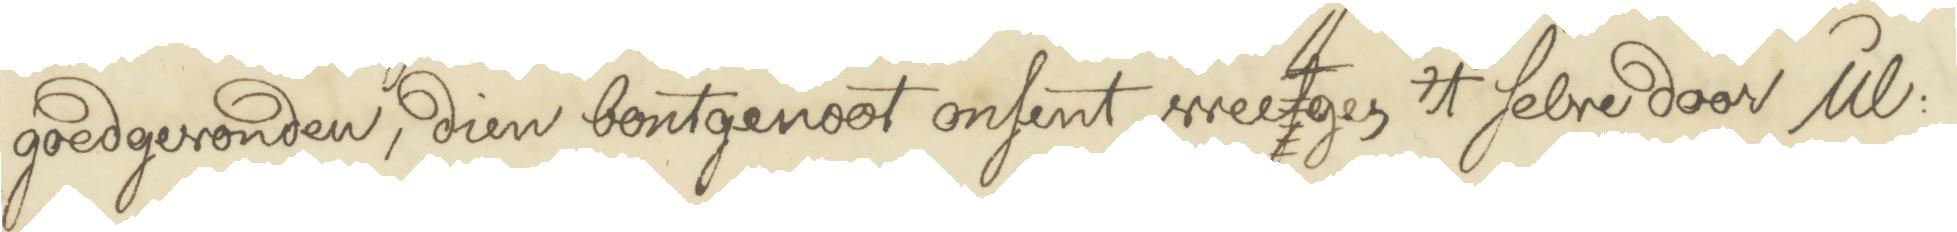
goedgevonden, dien bontgenoot onsent weefgen ’t Selve door Ul:
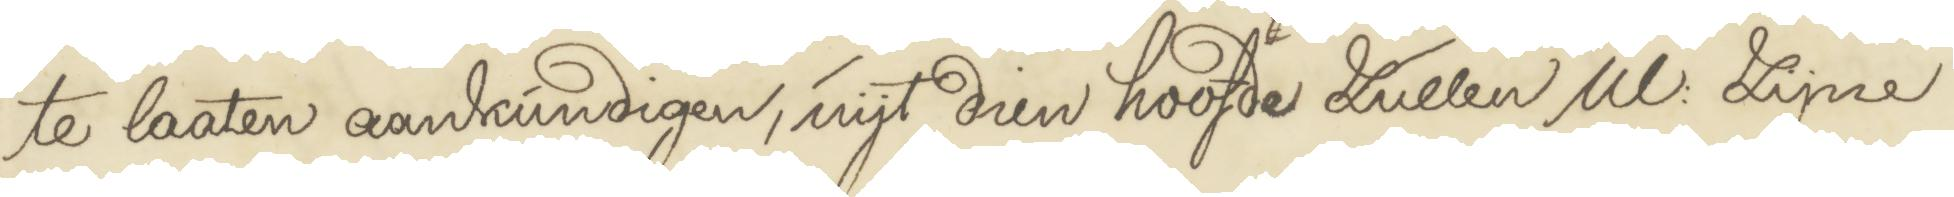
te laaten aankundigen, uijt dien hoofde Zullen Ul: Zijne
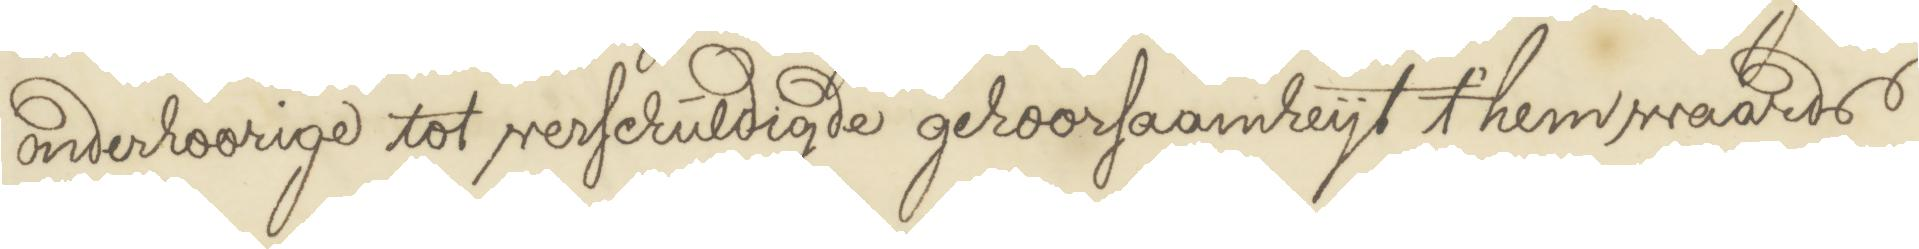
onderhoorige tot verschuldigde gehoorsaamheijt 't hem waards
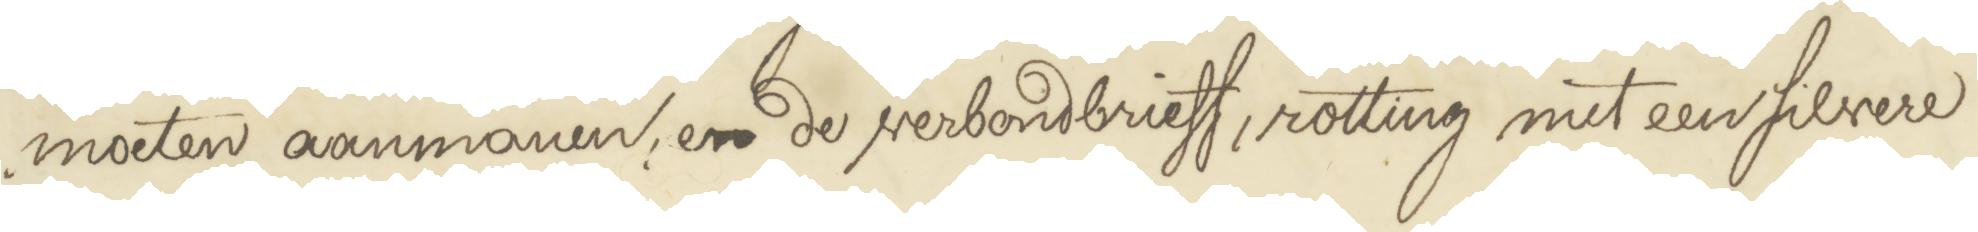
moeten aanmanen, en de verbondbrieff, rotting met een silvere
